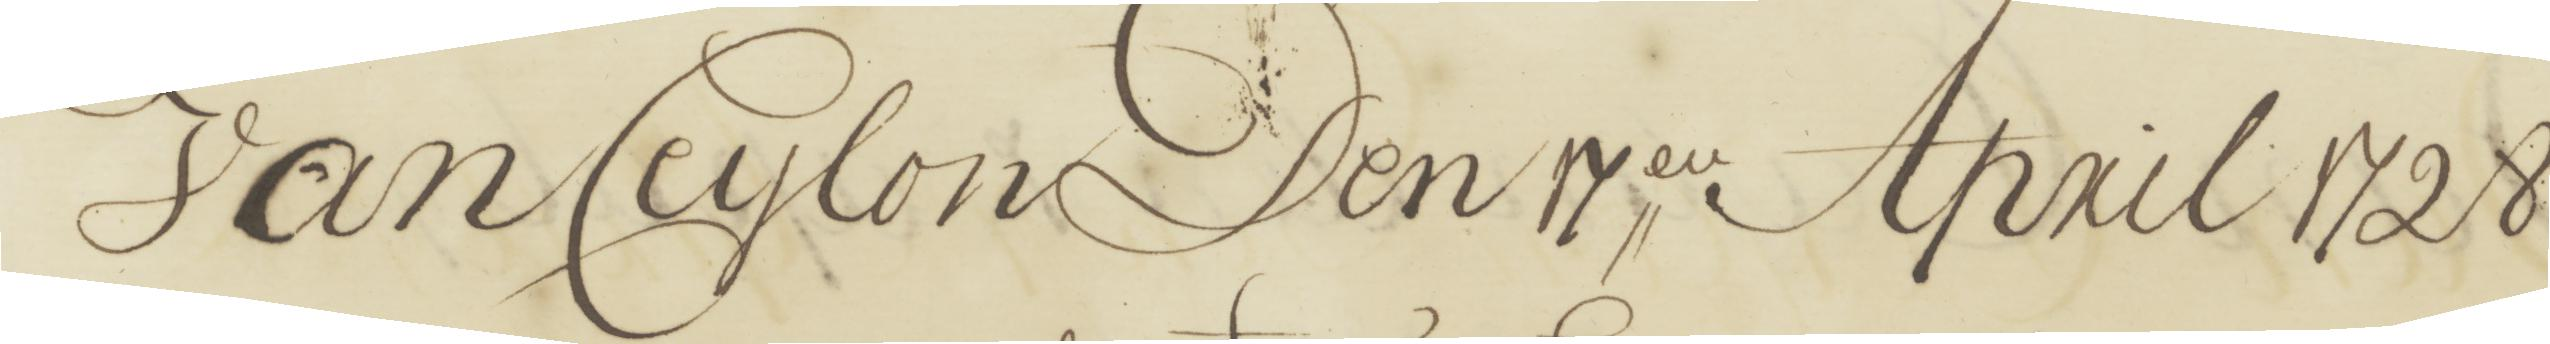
Van Ceylon Den 17„en April 1728
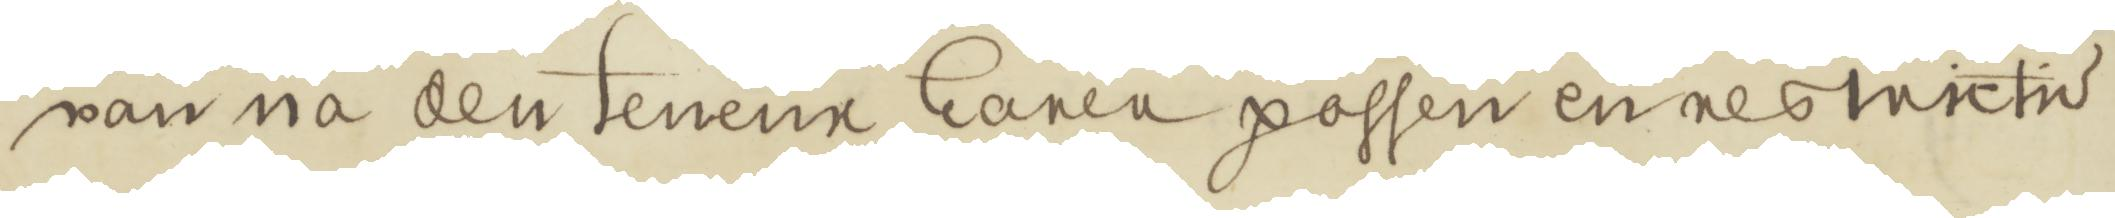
van na den teneur harer passen en restrictie
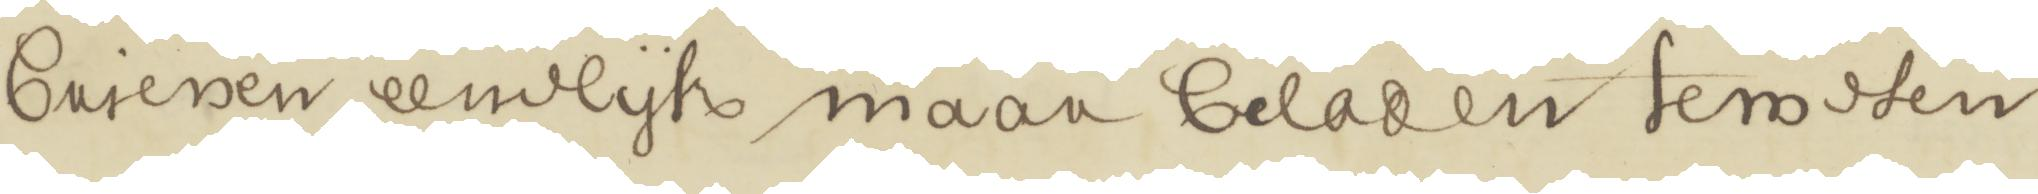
brieven eenelijk maar beladen tewesen
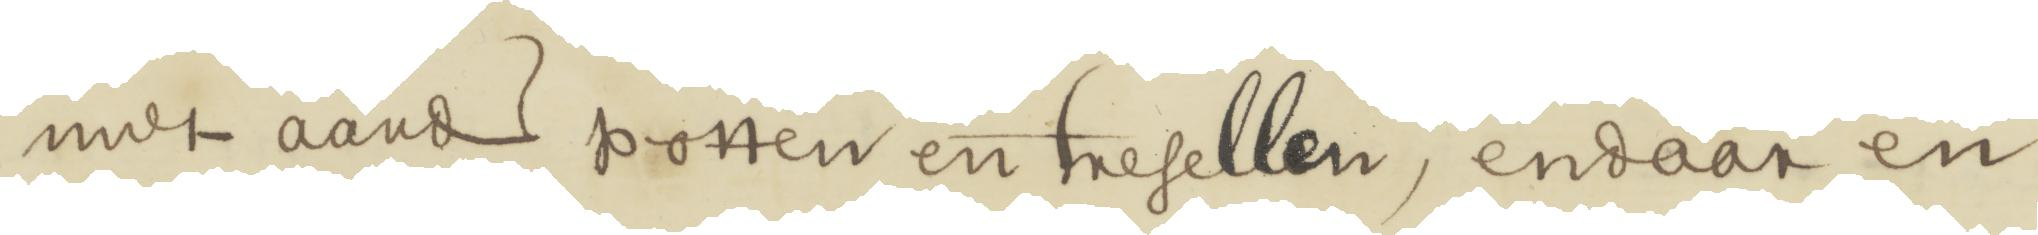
met aande potten en tresellen, endaar en
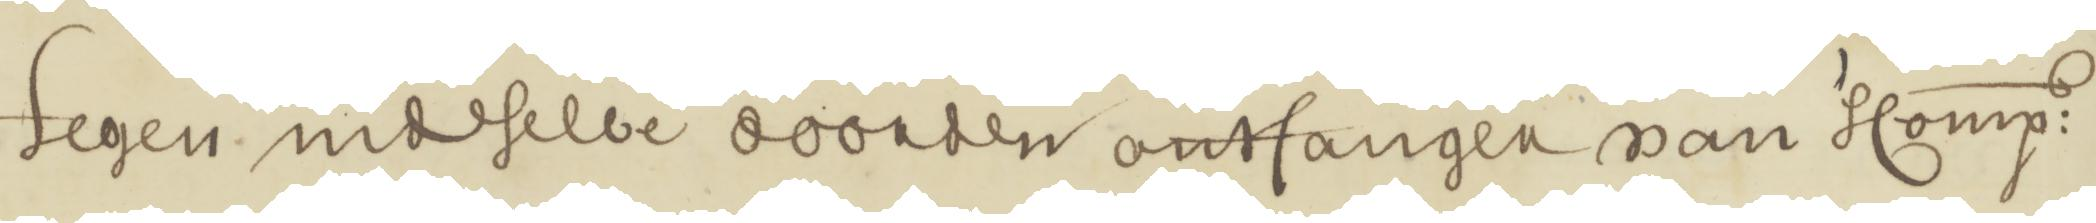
tegen in deselve doorden ontfanger van 'sComp:s
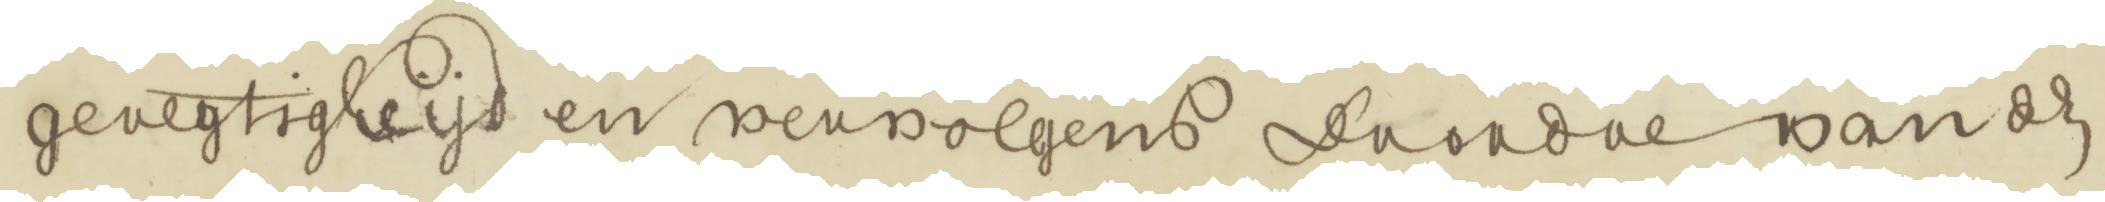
geregtigheijd en vervolgens terordre van den
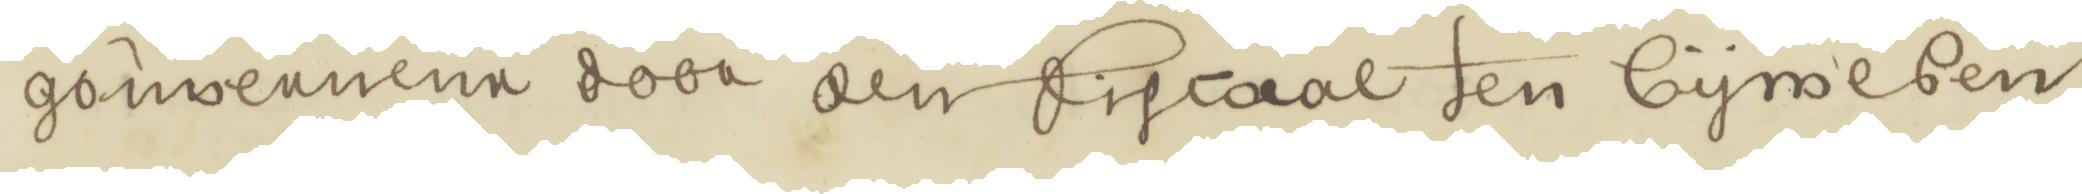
gouverneur door den fiscaal ten bijwesen
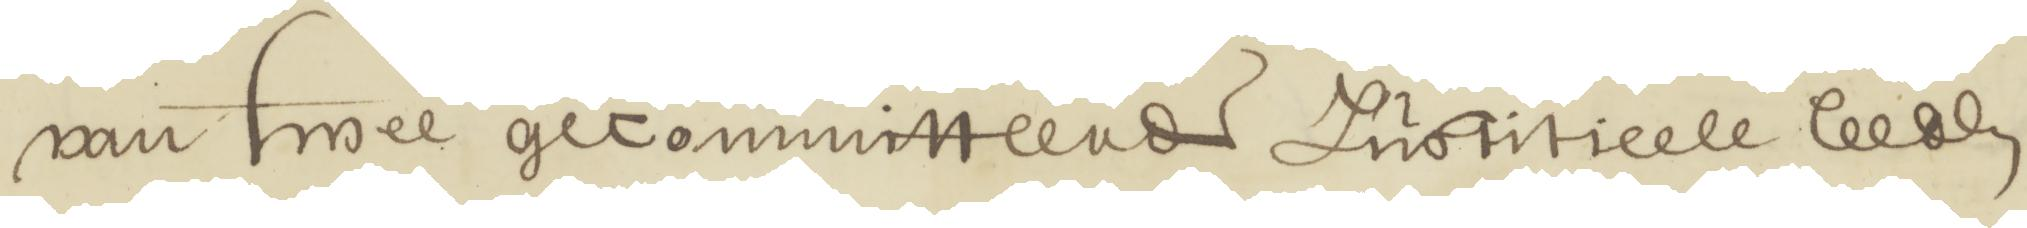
van twee gecommitteerde Iustitieele leeden
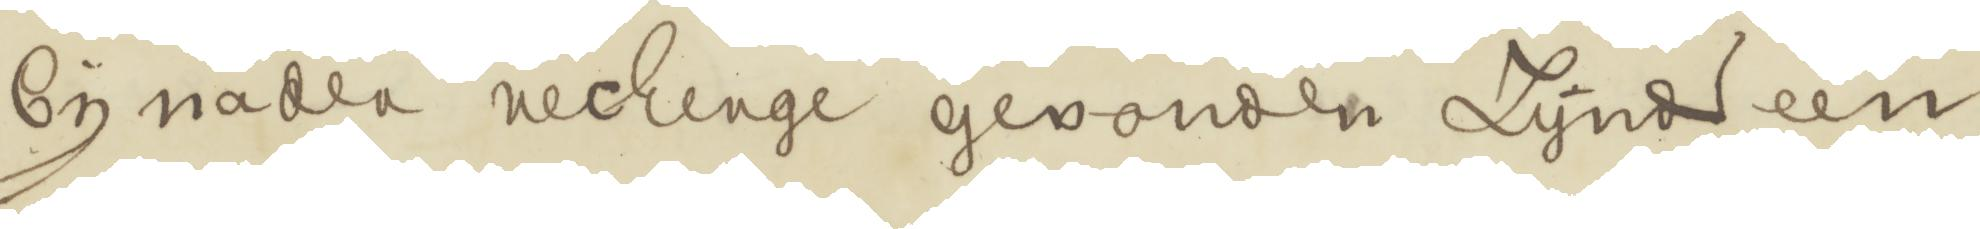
bij nader recherge gevonden zijnde een
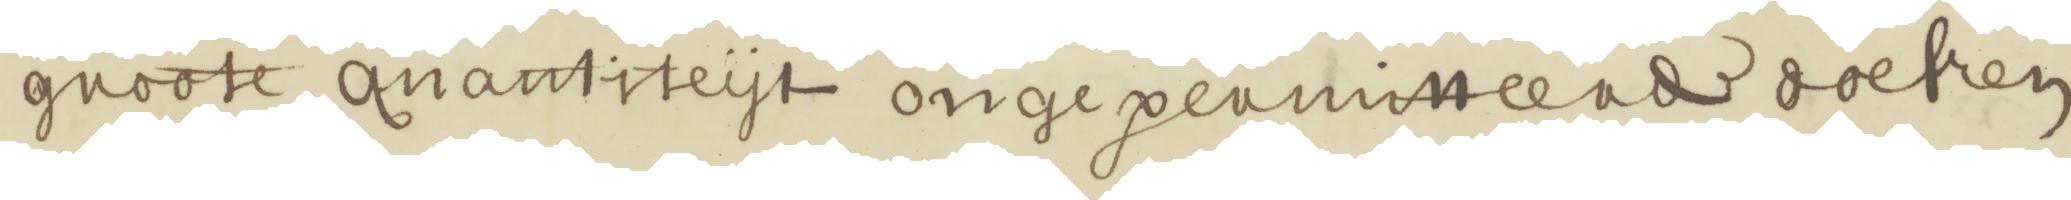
groote quantiteijt ongepermitteerde doeken
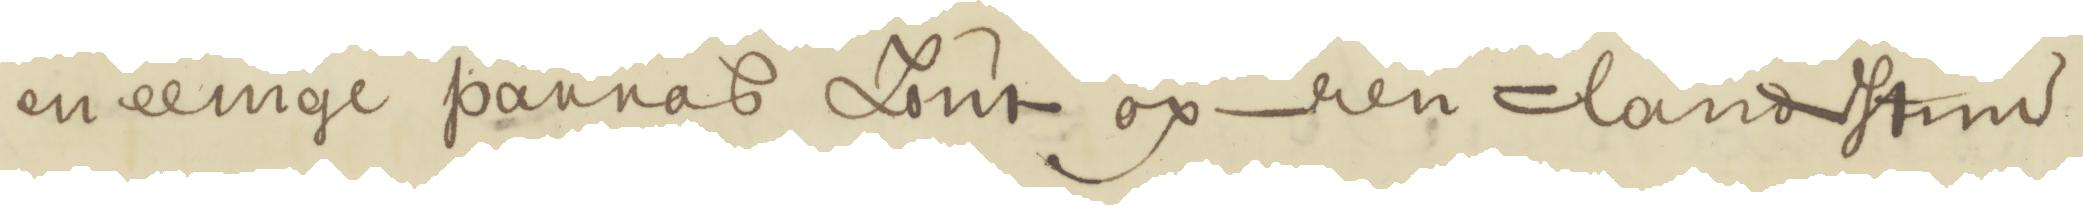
en eenige parras zout op een clandestine
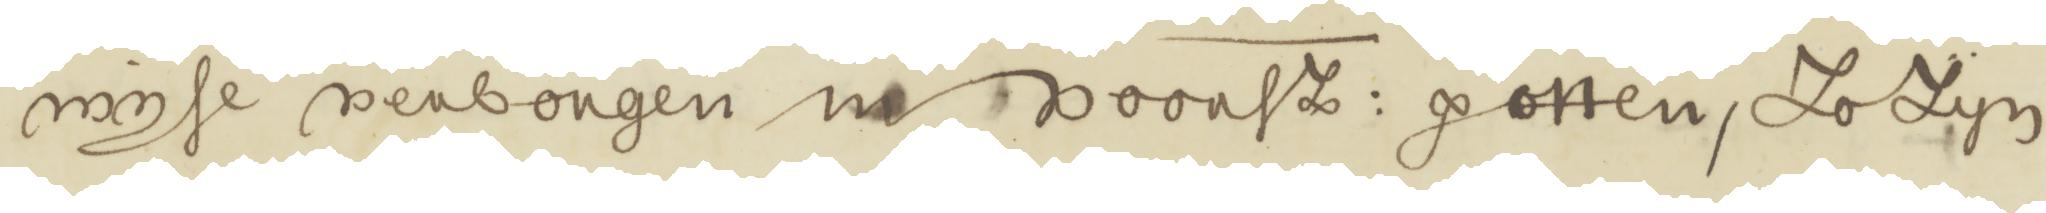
wijse verborgen in voorsz: potten, zo zijn
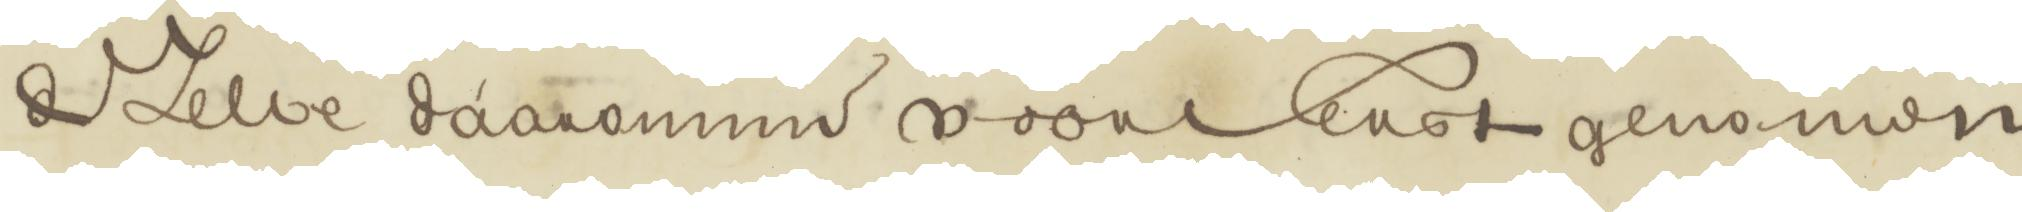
dezelve daaromme voor Eerst genomen
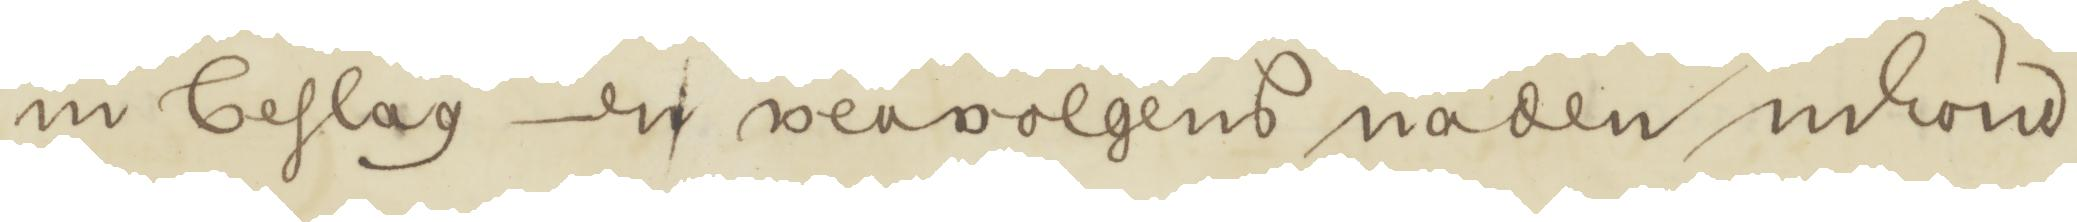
in beslag en vervolgens na den inhoud
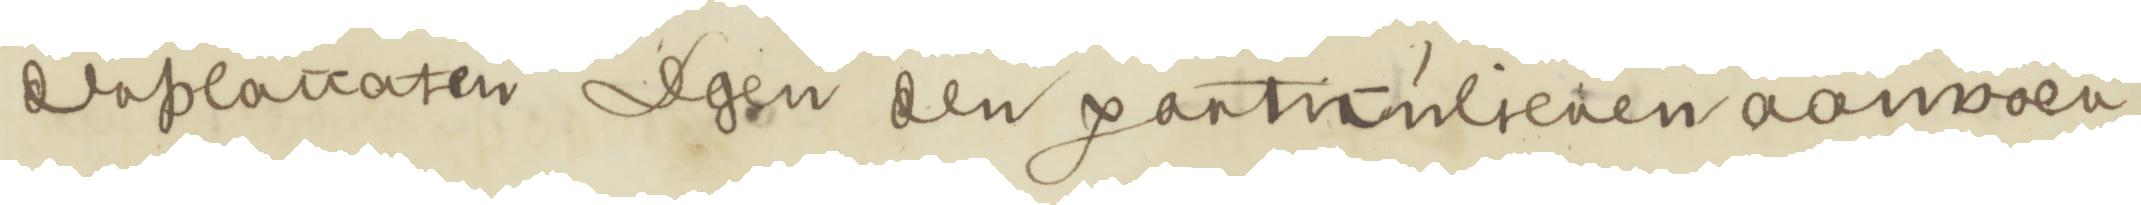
derplaccaten tegen den particulieren aanvoer
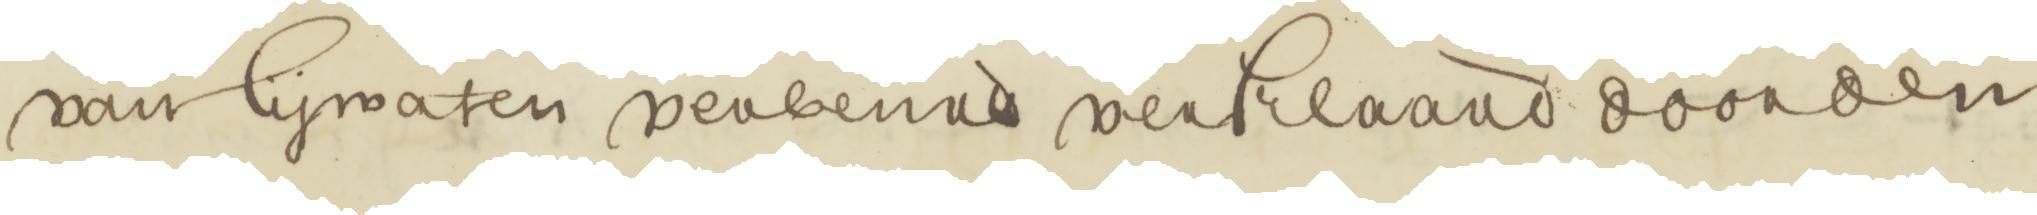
van lijwaten verbeurd verklaard door den
